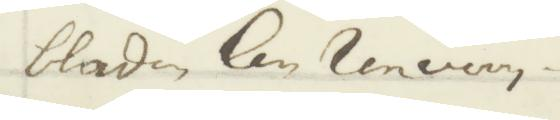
bladen Een renvooy
